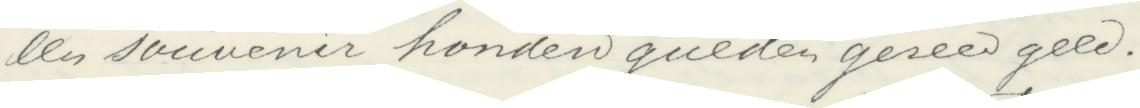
een souvenir honderd gulden gereed geld.
